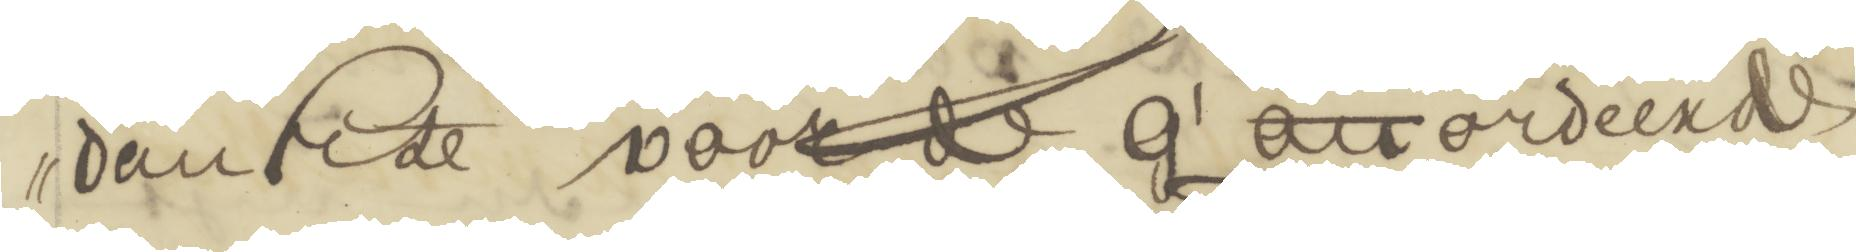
„dankte voor de g'accordeerde
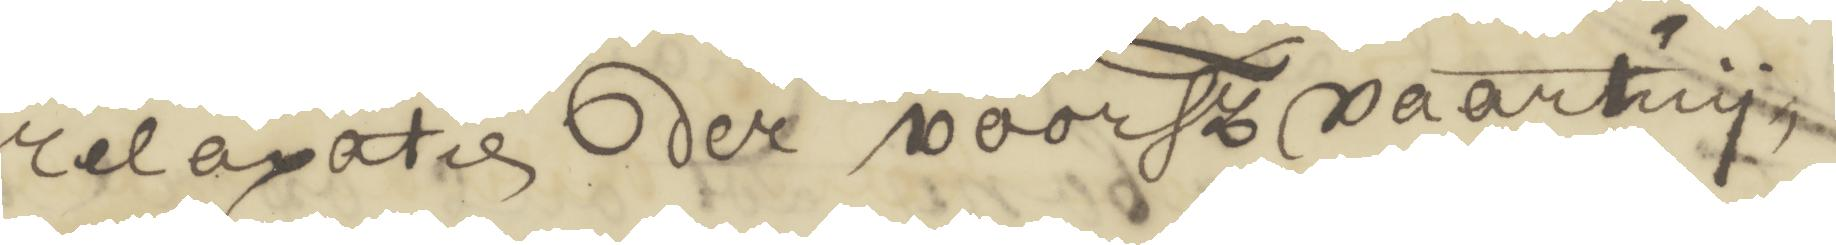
relaxatie der voorsz vaartuij„
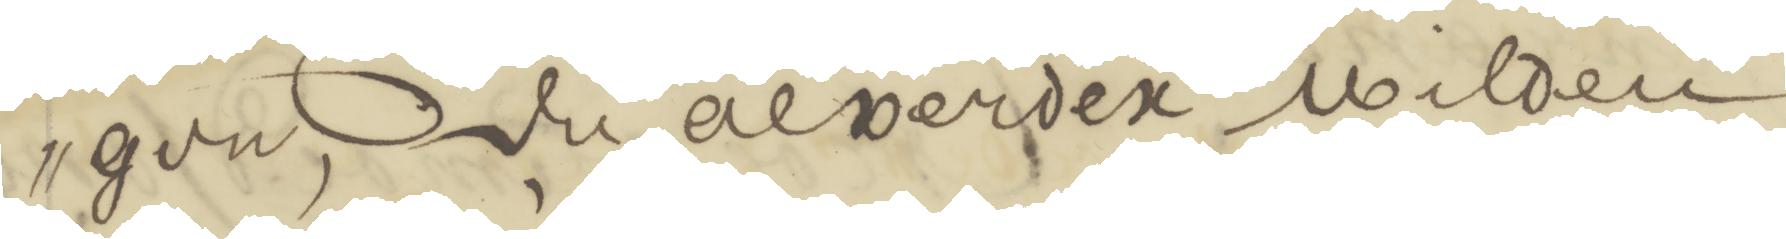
„gen, en alverder wilden
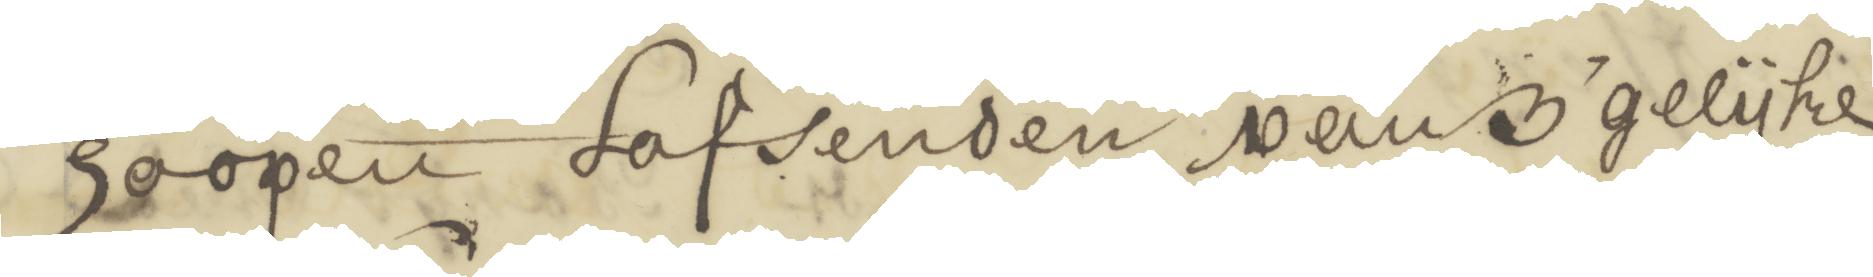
hoopen 'tafsenden van 3' gelijken
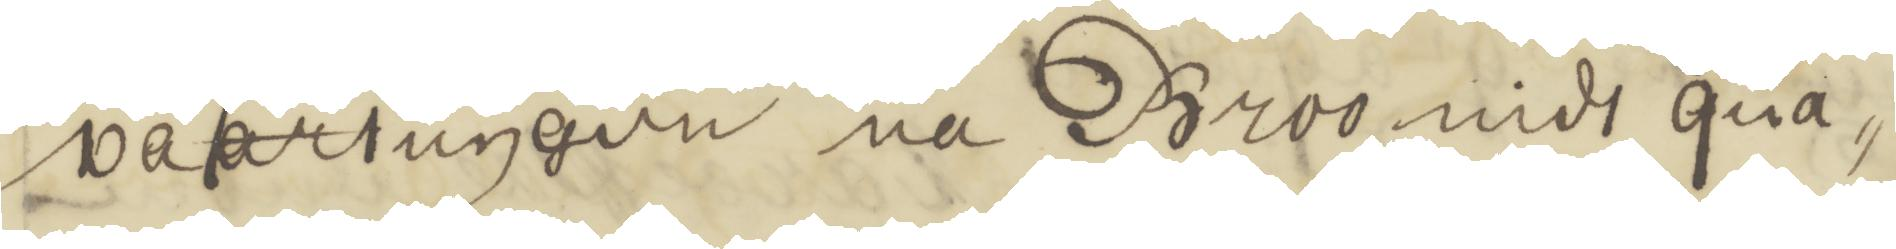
vaartuijgen na Broo niet qua„
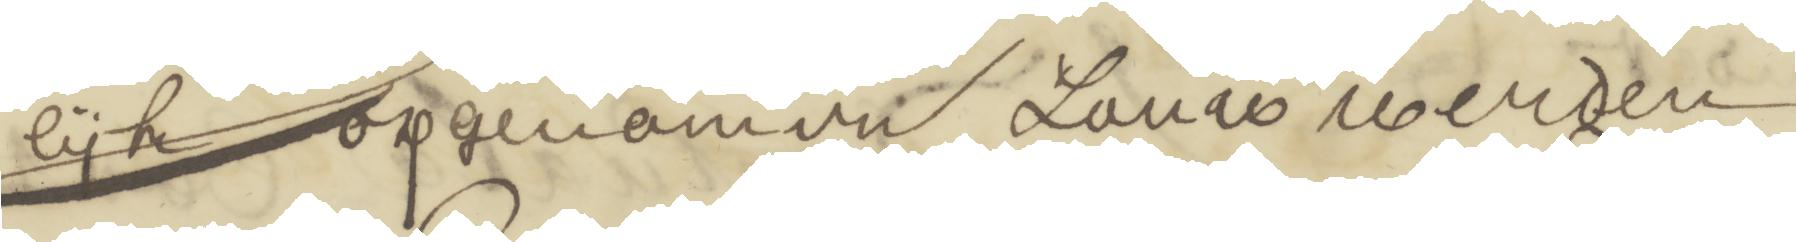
lijk opgenomen zouw werden
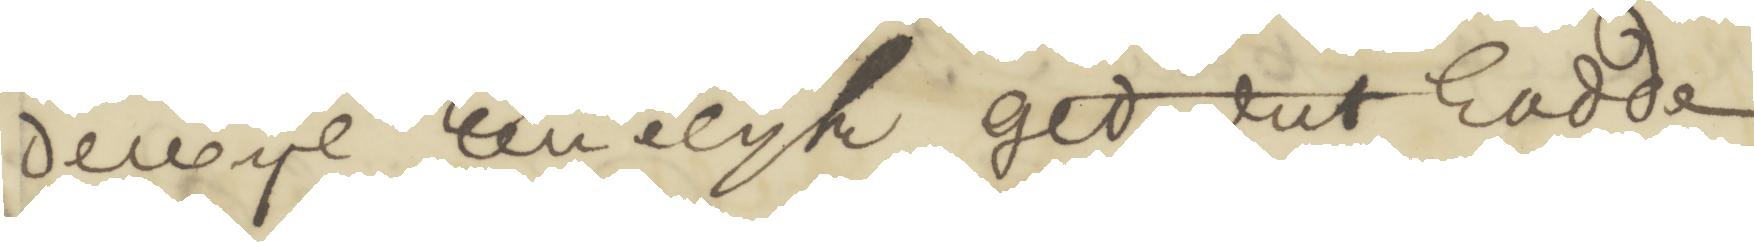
dewijl eenelijk gedient hadde
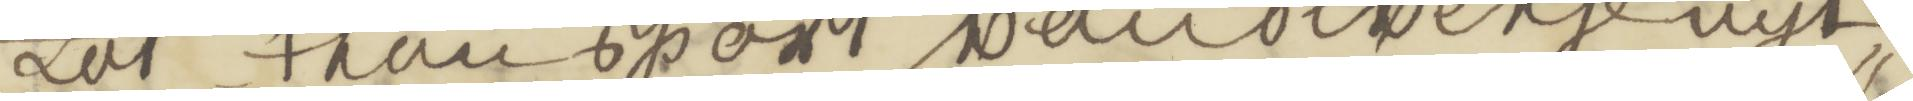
tot transport van diverse uijt„
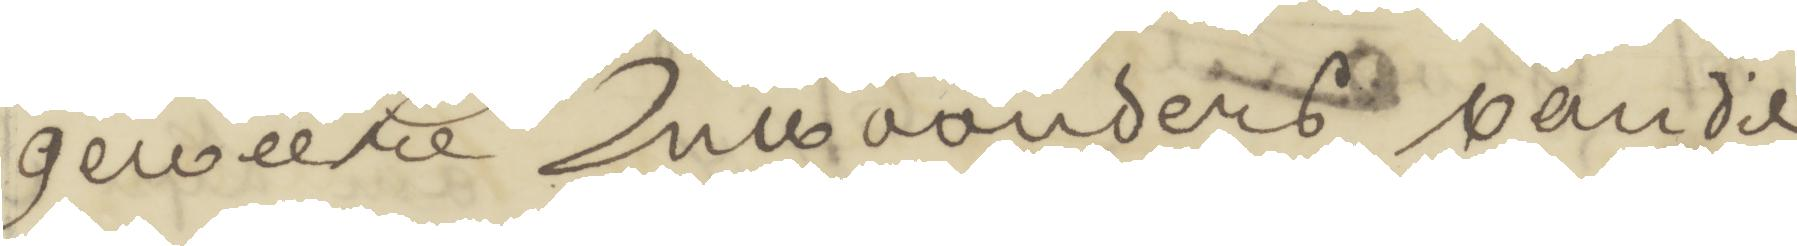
geweeke Inwoonders van die
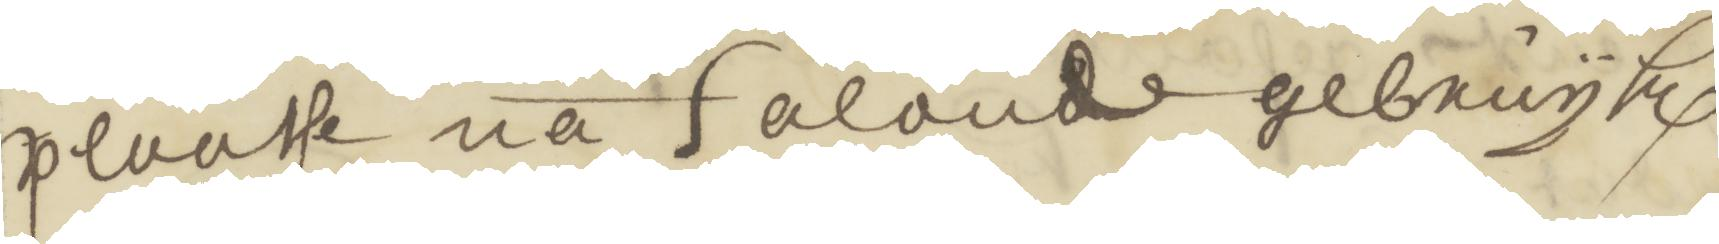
plaatse na 't aloude gebruijk
